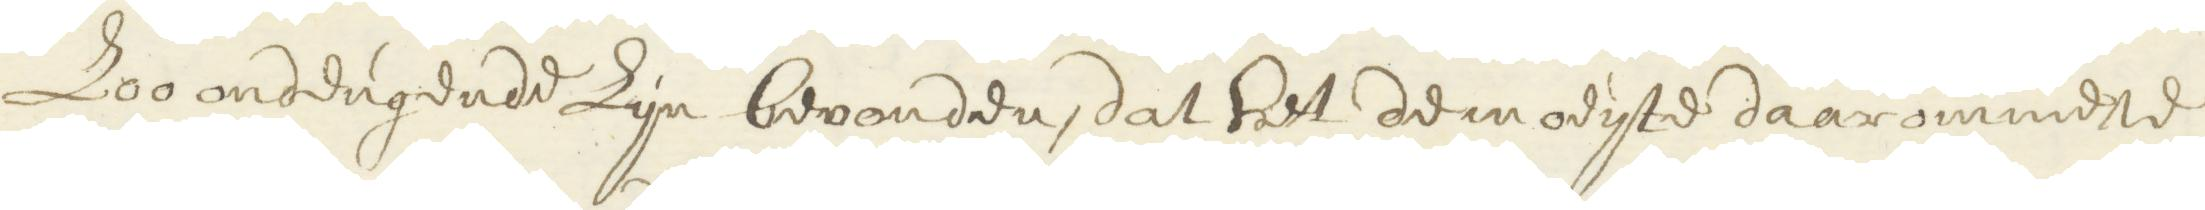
zoo ondeugende zijn bevonden, dat het de moeijte daaromme te
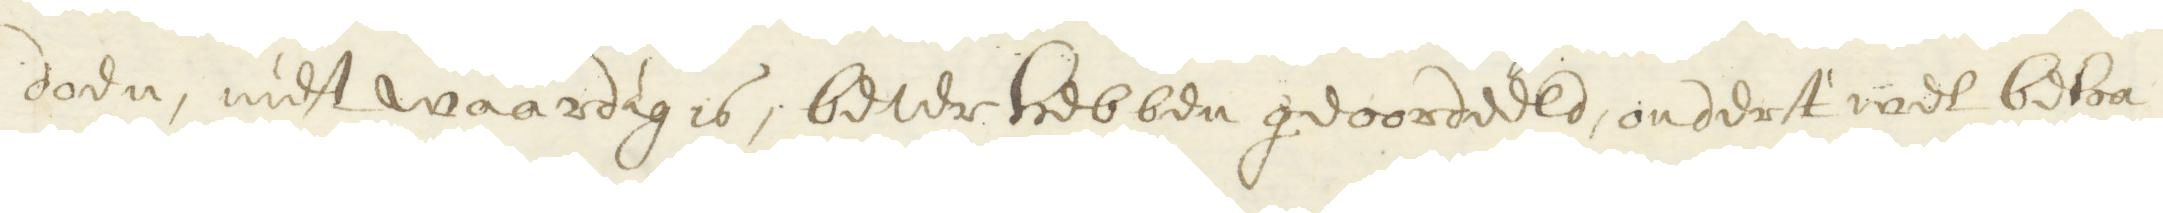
doen, niet waardig is, beter hebben geoordeeld, onder 't wel beha
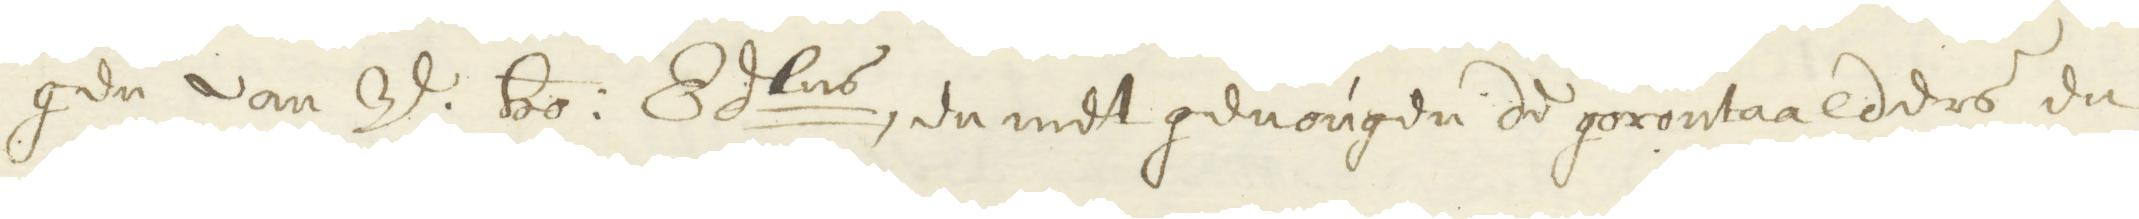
gen van V. Ho: Ed=lns, en met genougen de gorontaalders en
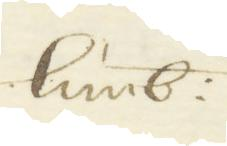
limb:
